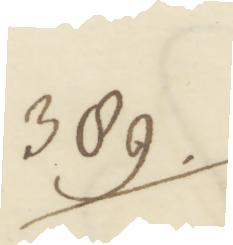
389.
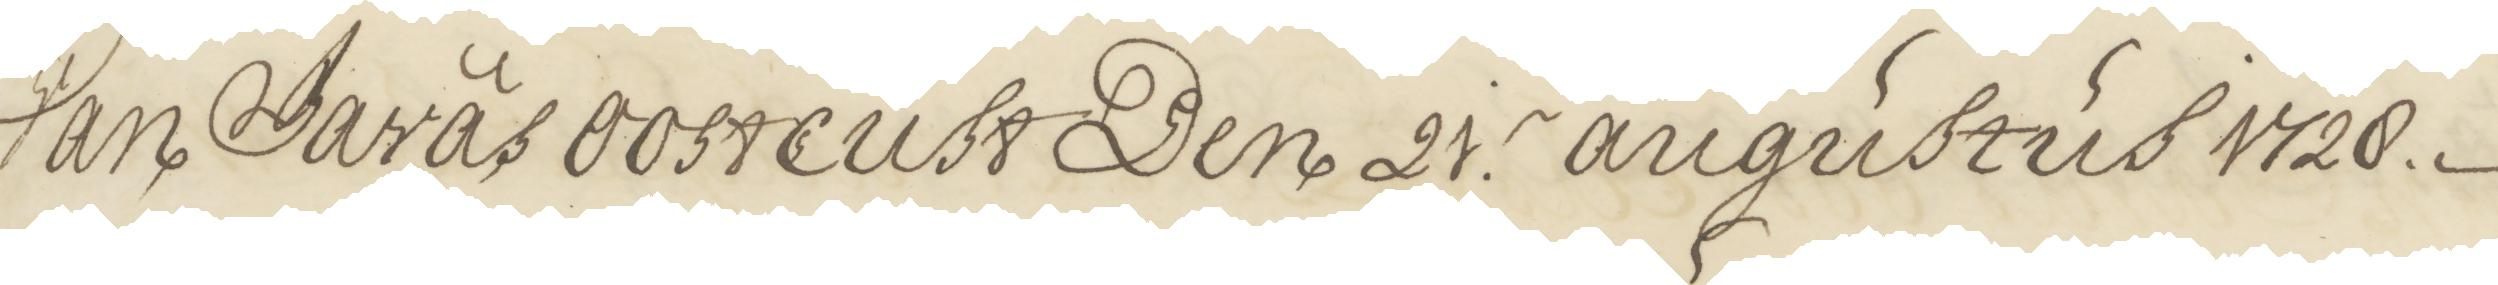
Van Javâs oostcust Den 21:' augustus 1728.
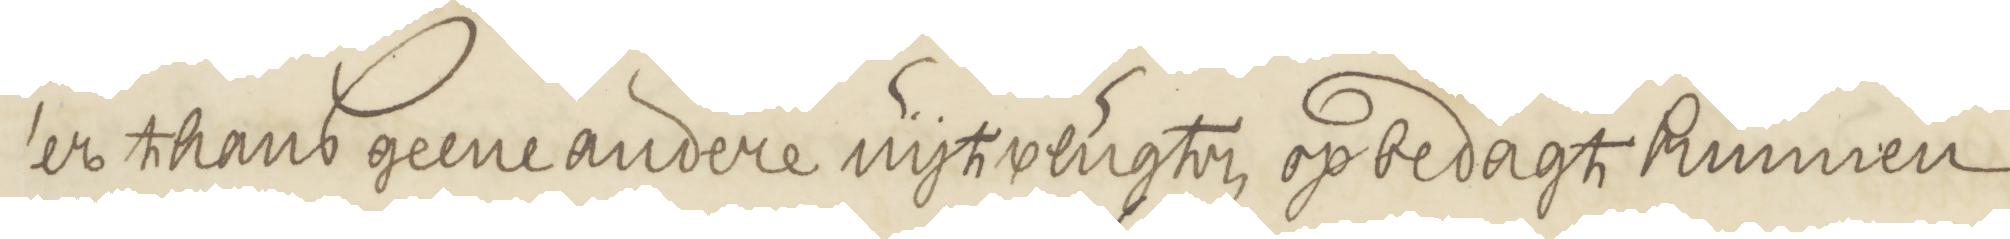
'er thans geene andere uijtvlugten op bedagt kunnen
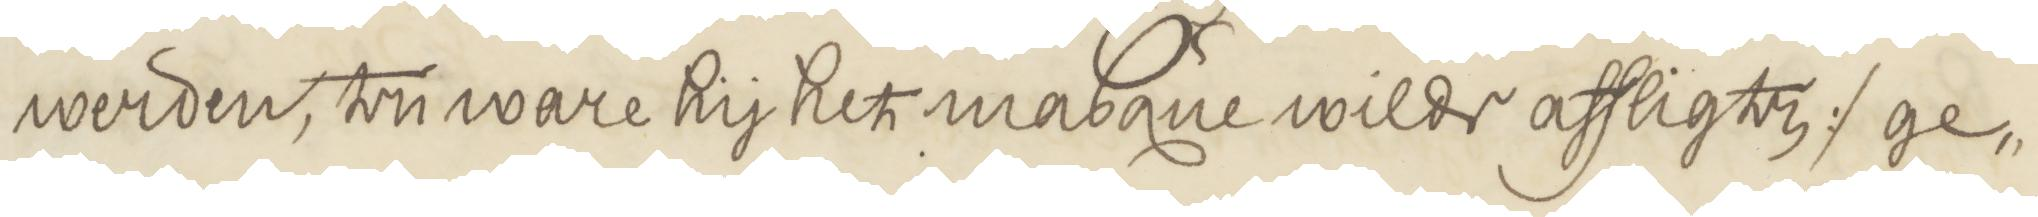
werden, ten ware hij het masque wilde affligten :/ ge„
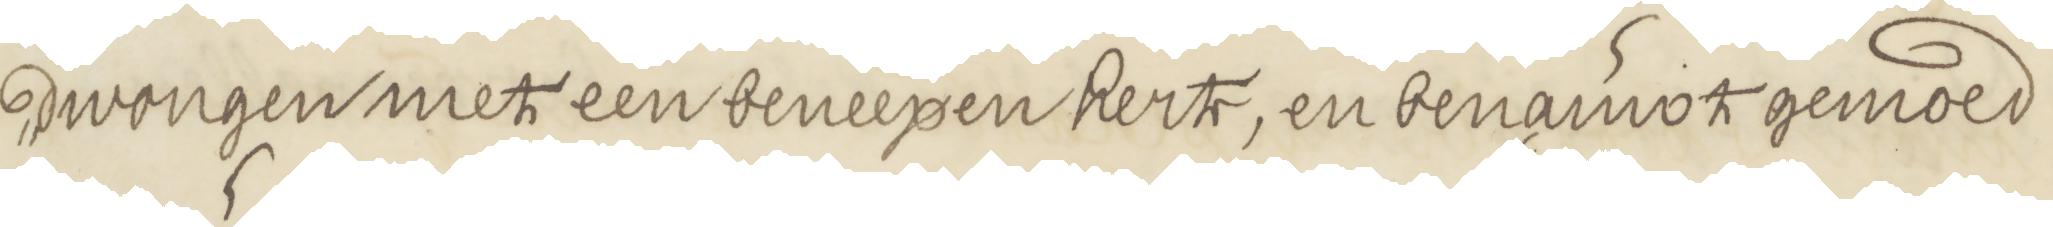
„dwongen met een beneepen herte, en benauwt gemoed
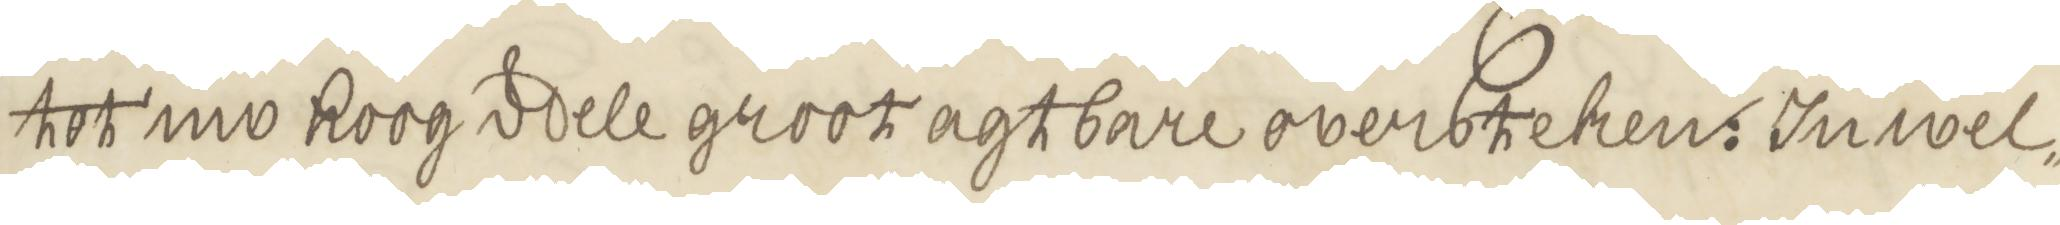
tot uw hoog Edele groot agtbare oversteken: Jn wel„
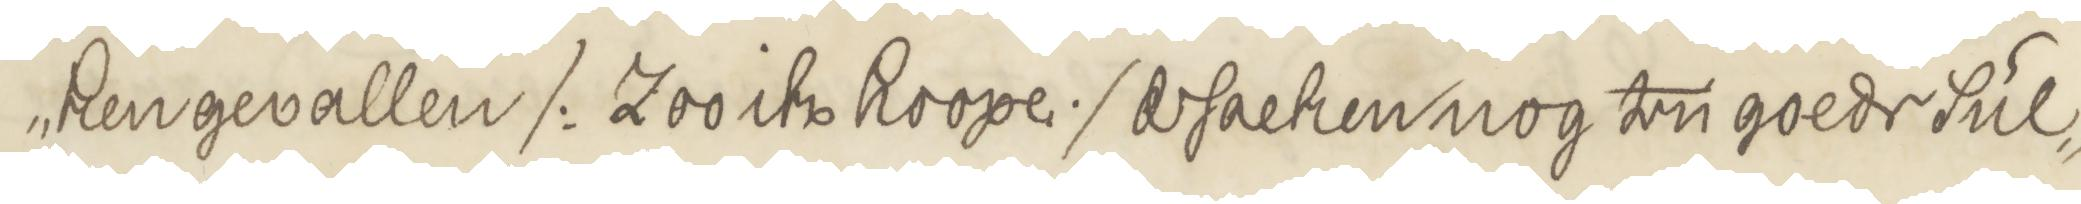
„ken gevallen /: zoo ik hoope:/ de saeken nog ten goede sul„
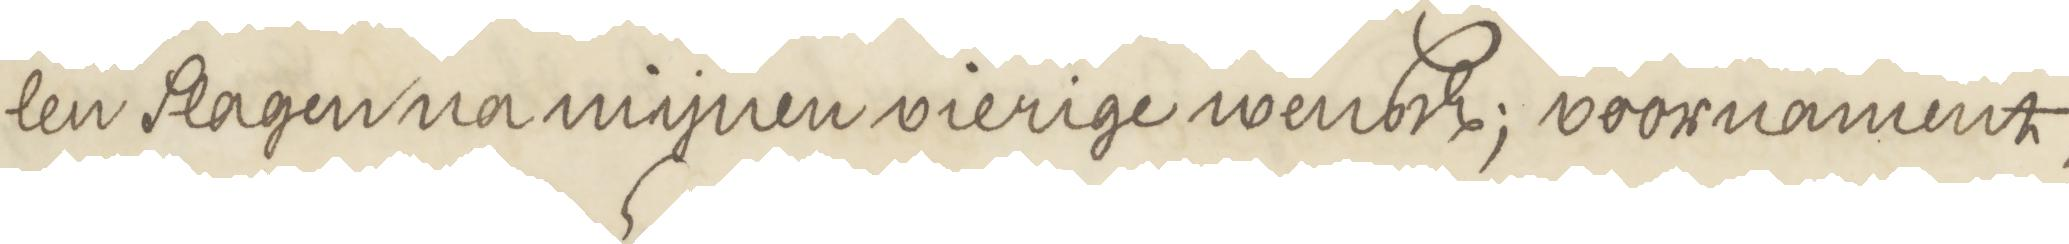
len slagen na mijnen vierige wensch; voornament
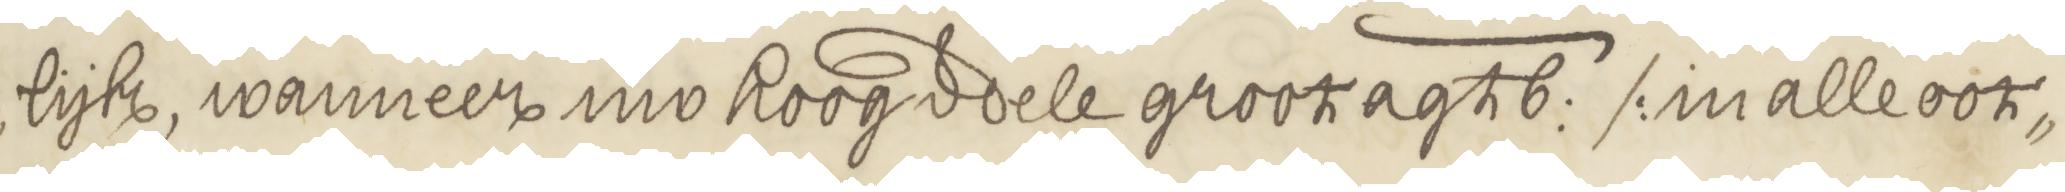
lijk, wanneer uw hoog Edele groot agtb: /:in alle oot„
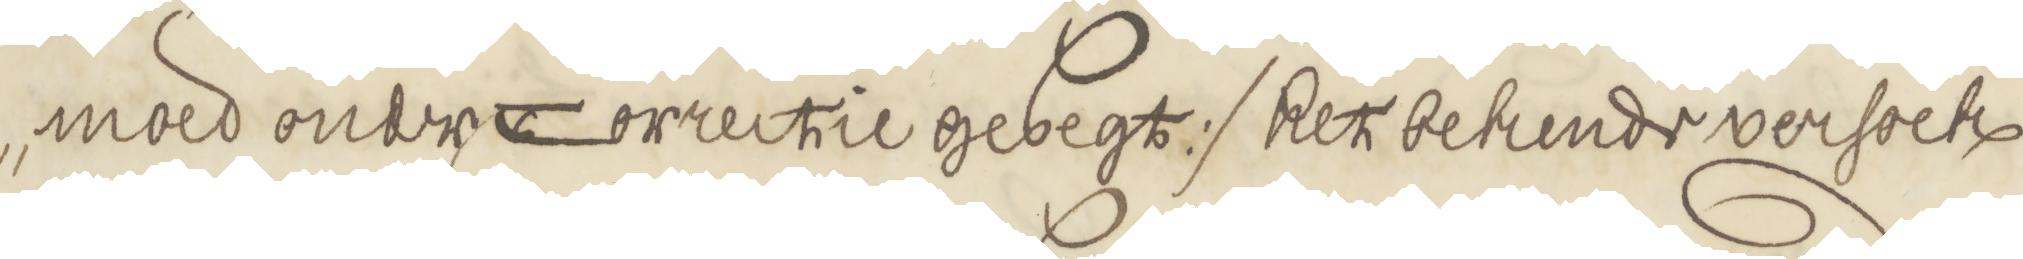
„moed onder correctie gesegt:/ het bekende versoek
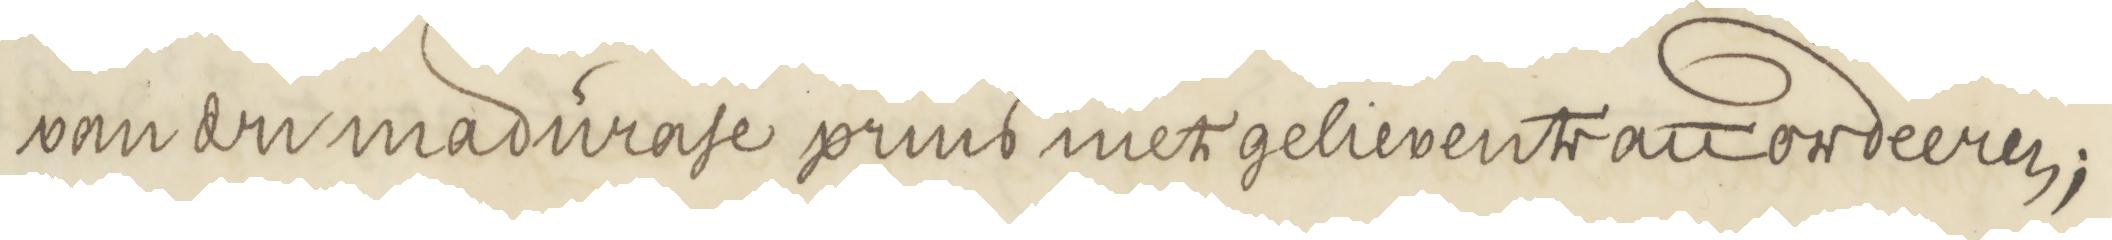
van den madurase prins niet gelieven te accordeeren;
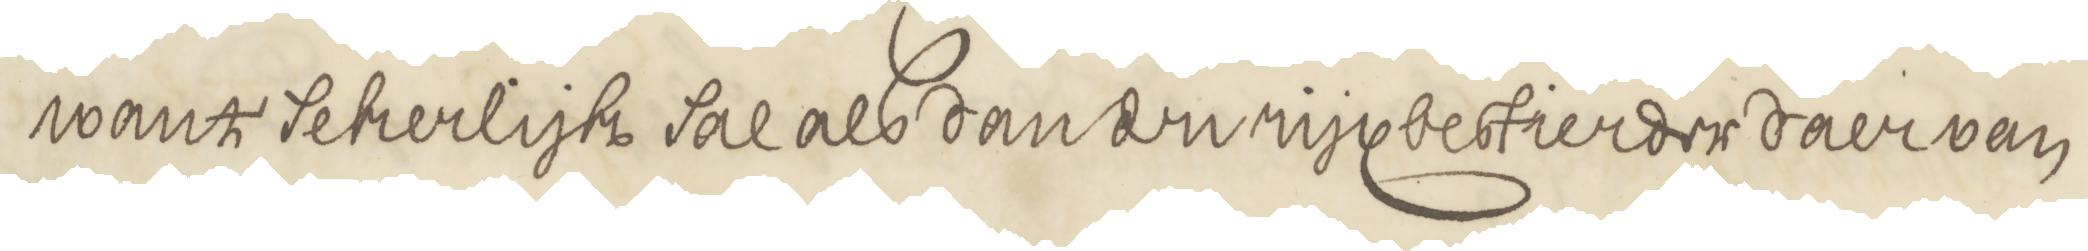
want sekerlijk sal als dan den rijxbestierder daer van
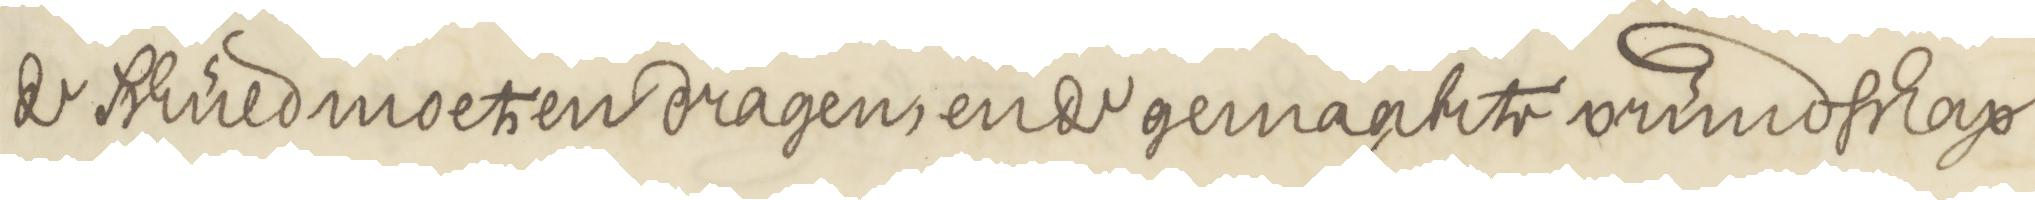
de schuld moeten dragen, en de gemaakte vrundschap
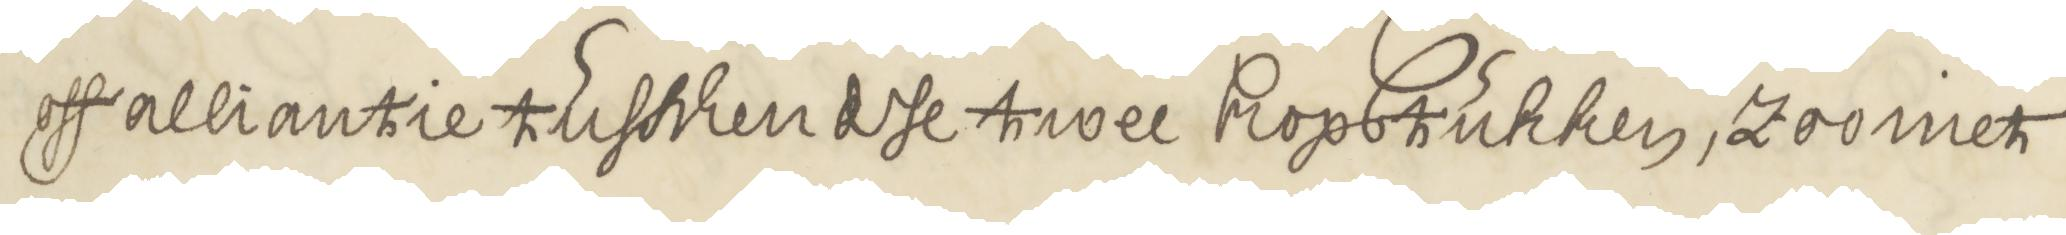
off alliantie tusschen dese twee kopstukken, zoo niet
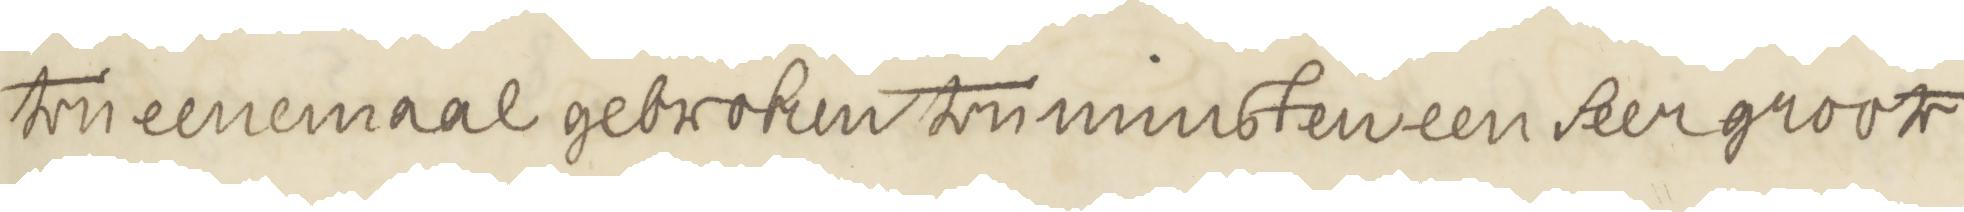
ten eenemaal gebroken ten minsten een seer groote
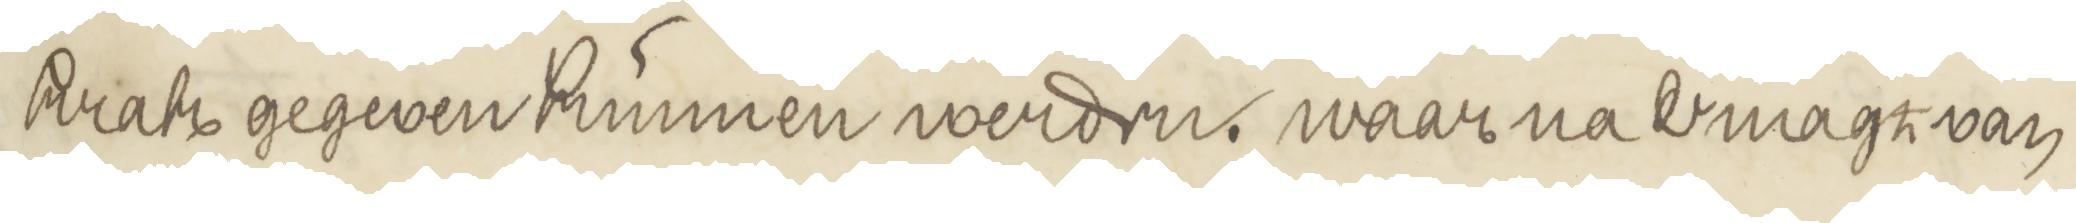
krak gegeven kunnen werden. waar na de magt van
